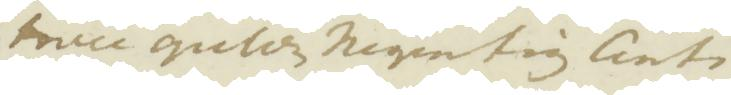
twee gulden Negentig Cents
